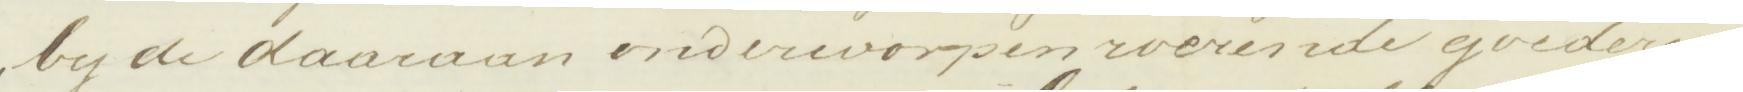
by de daaraan onderworpen roerende goederen
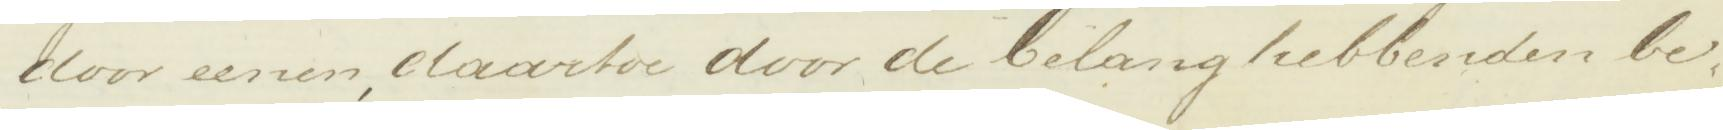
door eenen, daartoe door de belang hebbenden be
